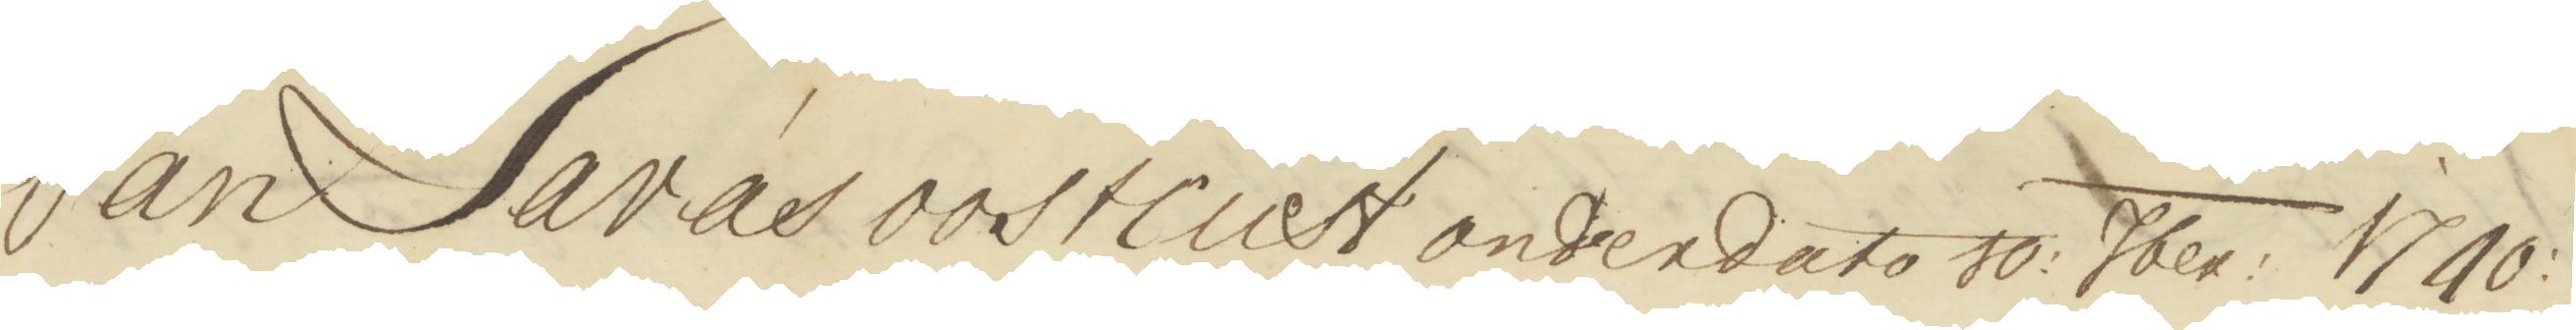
Van Iava's oost cust onder dato 10: 7ber: 1740:
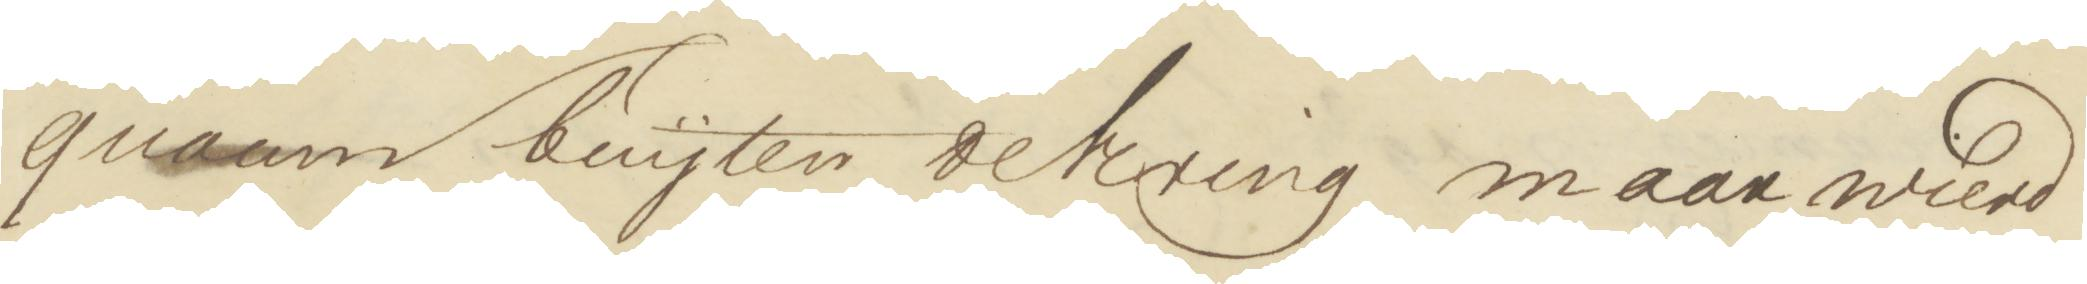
quaam buijten dekring maar wierd
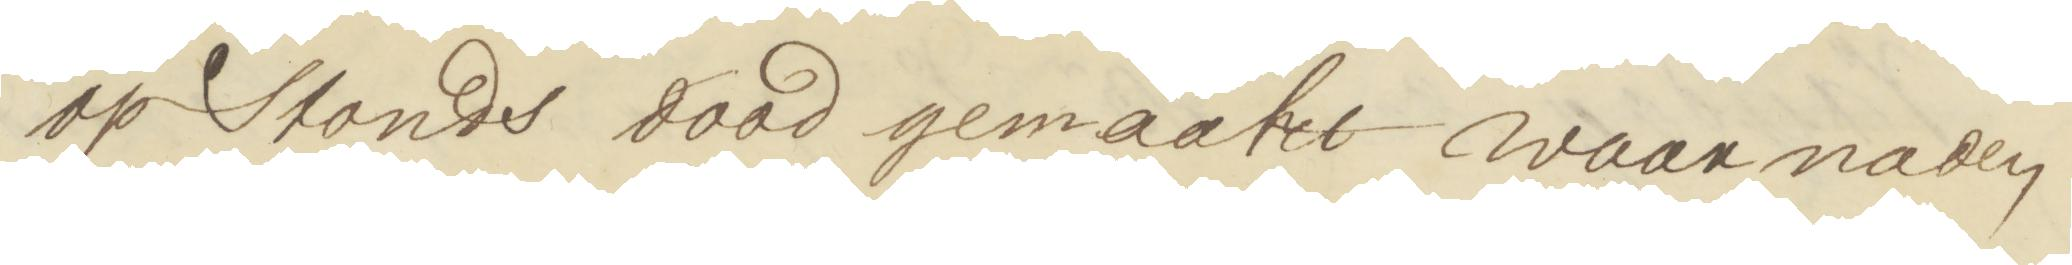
op stonds dood gemaakt waar naden
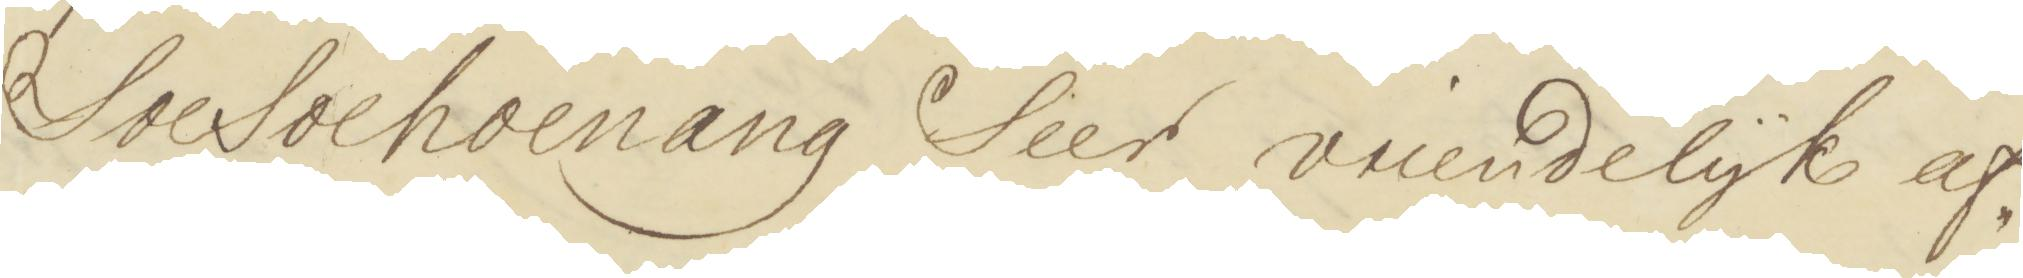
soesoehoenang seer vriendelijk af„
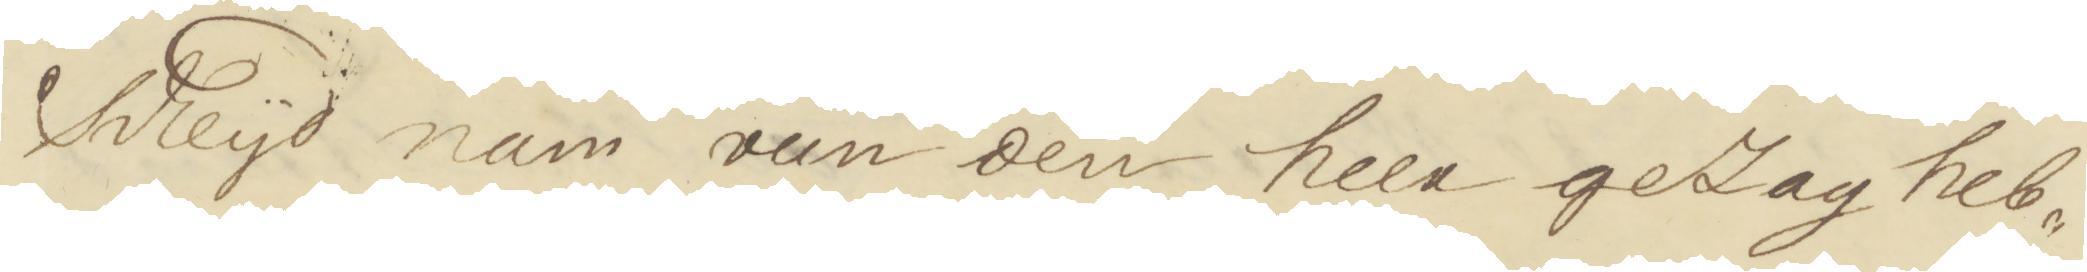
scheijd nam van den heer gezag heb„
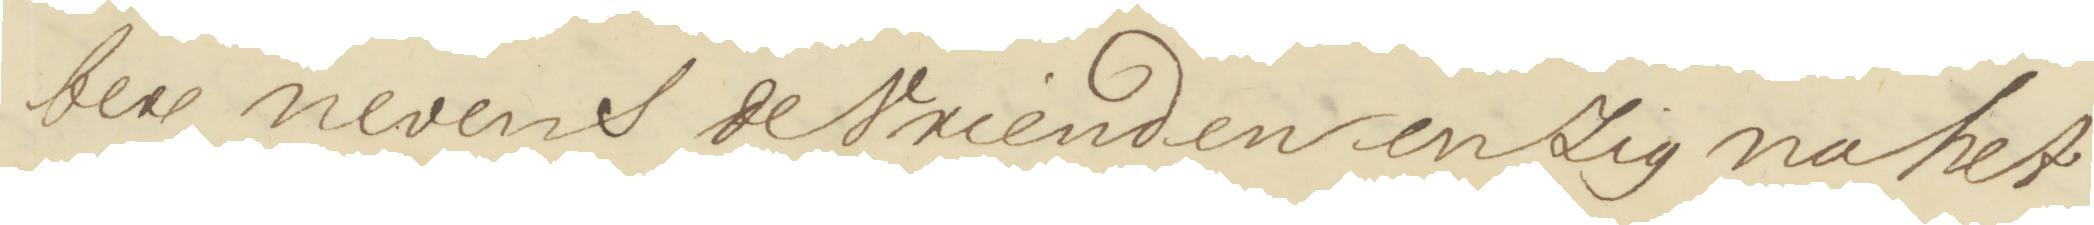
ber nevens de vrienden en zig na het
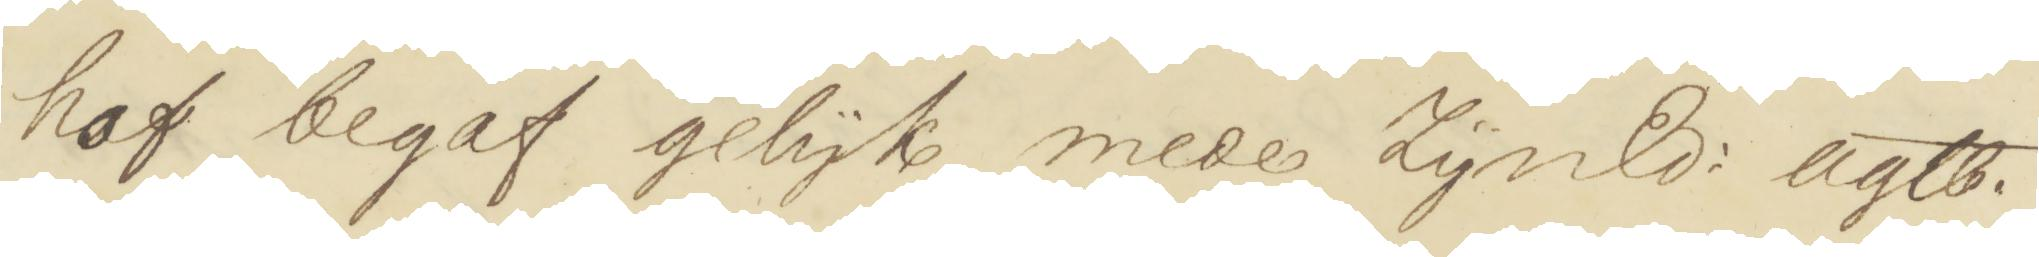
hof begaf gelijk mede zijn Ed: agtb:
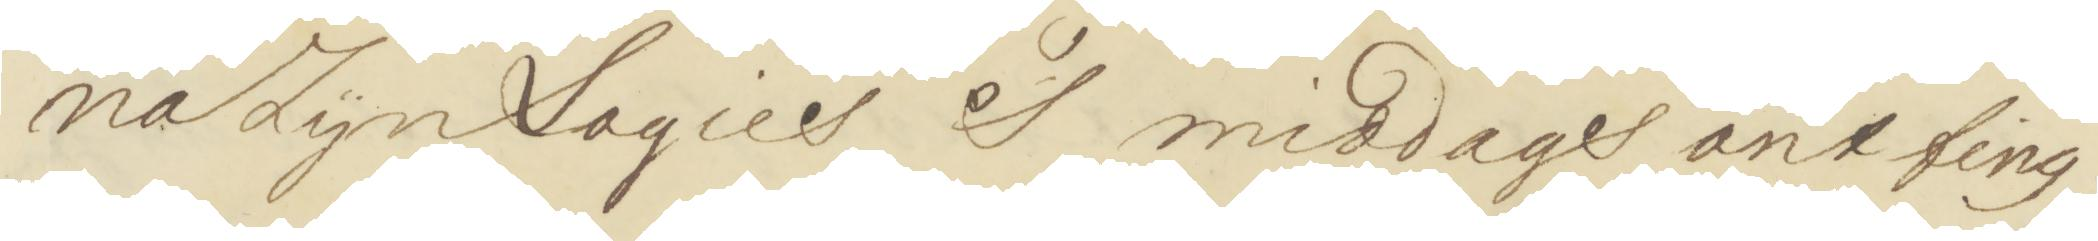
na zijn logies 's middags ontfing
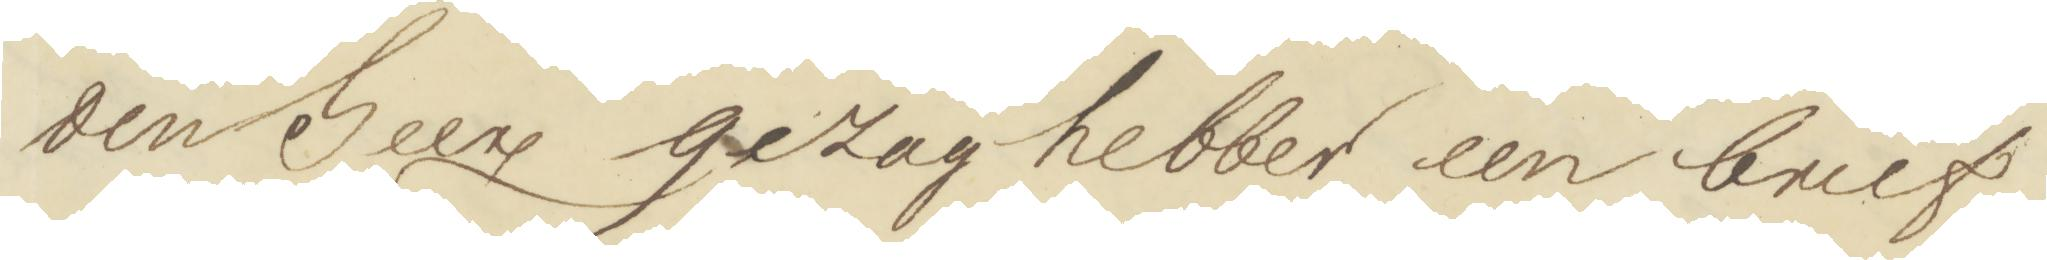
den heer gezaghebber een brief
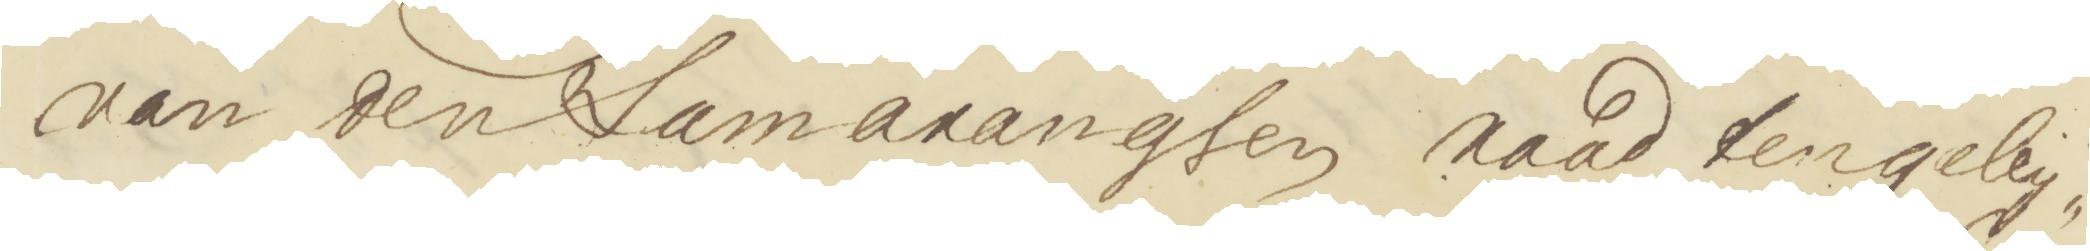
van den samarangsen raad ten geleij
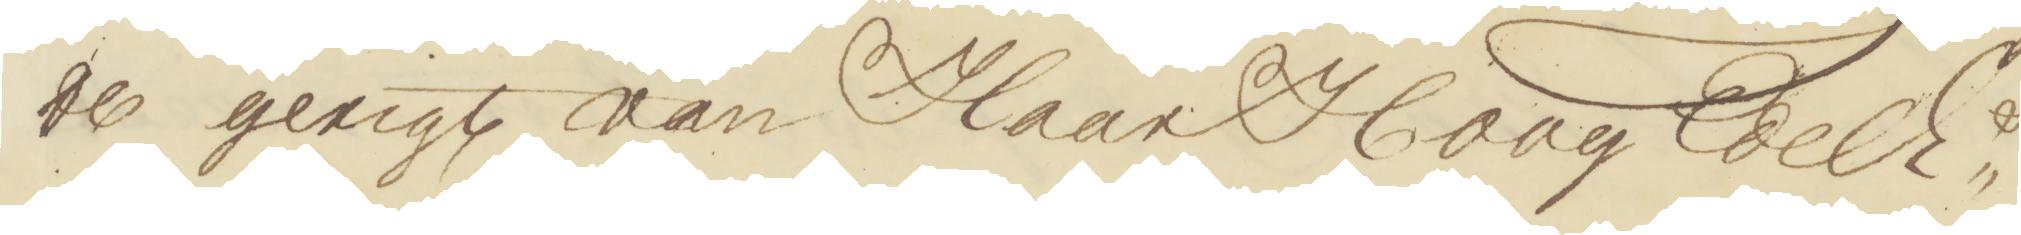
de gerigt van Haar Hoog Edelh„s
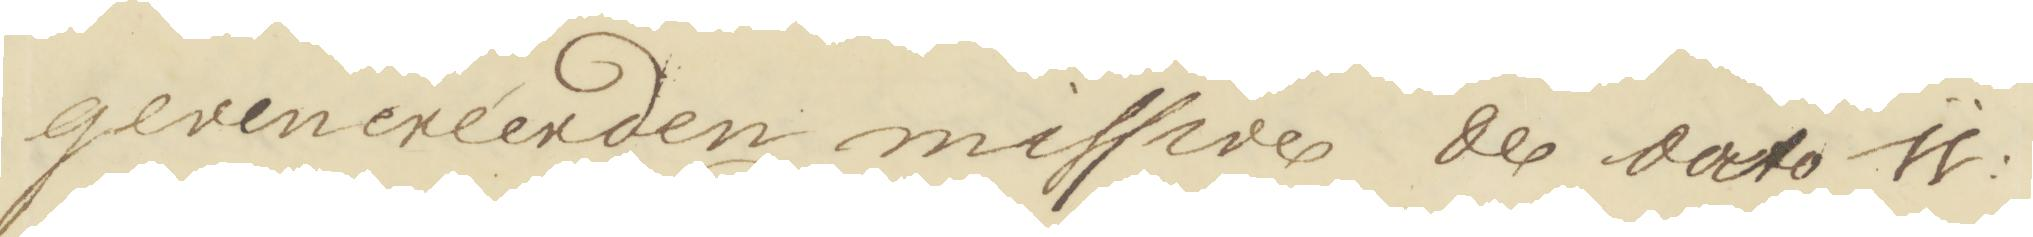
gevenereerden missive de dato 11:
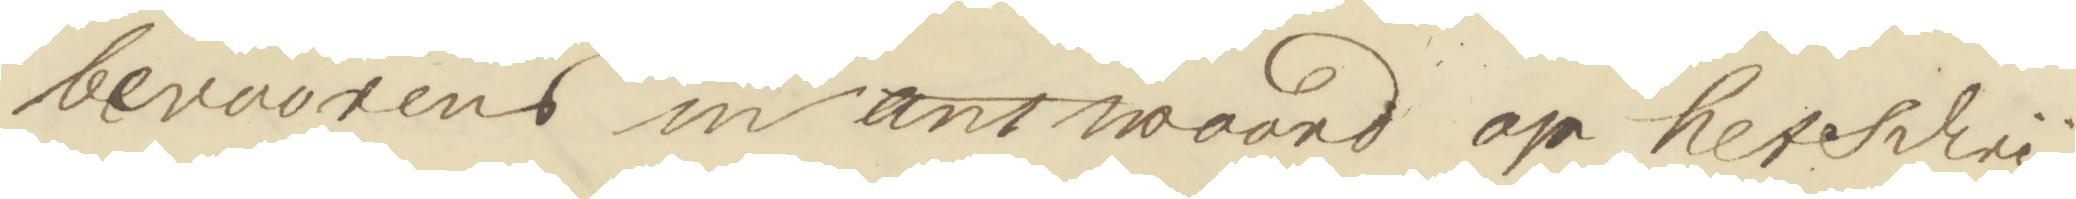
bevoorens in antwoord op het schrij
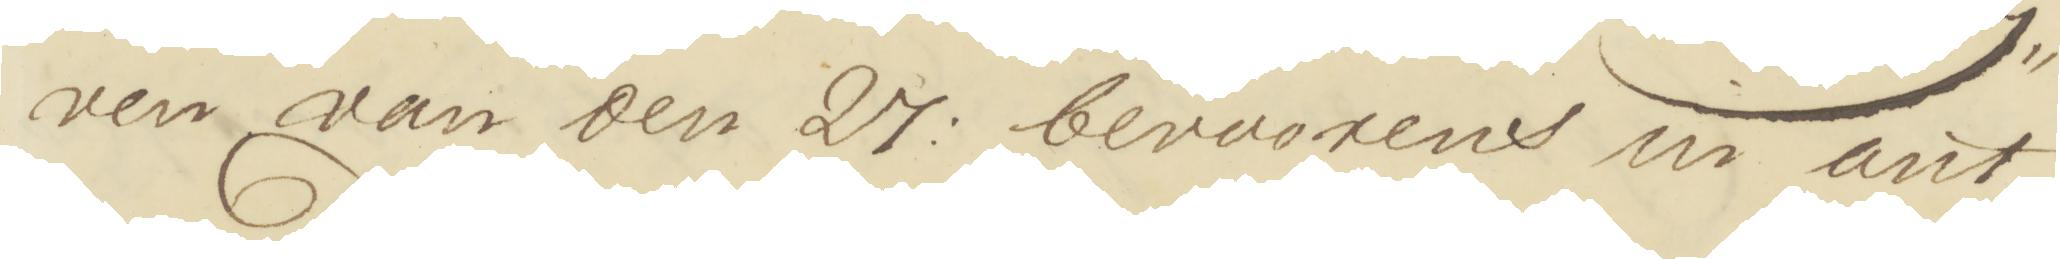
ven van den 27: bevoorens in ant
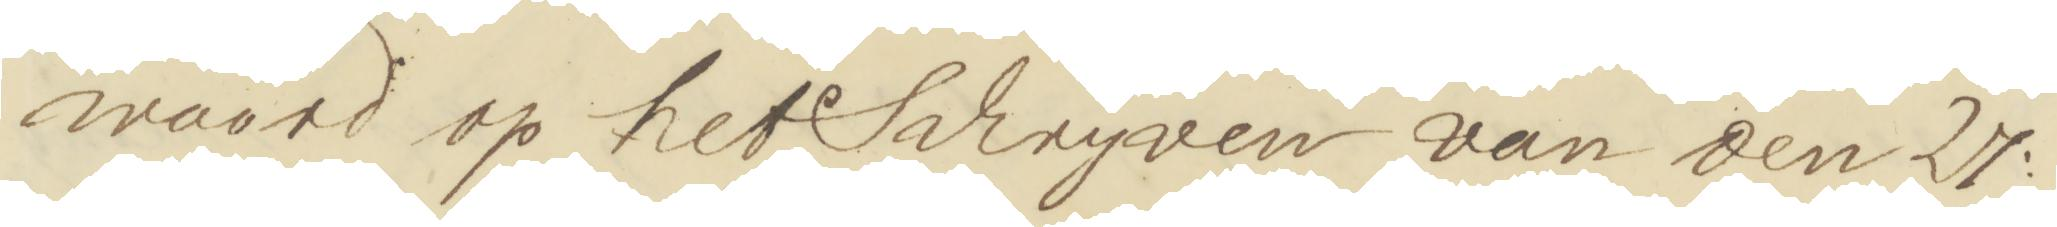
woord op het schrijven van den 27:
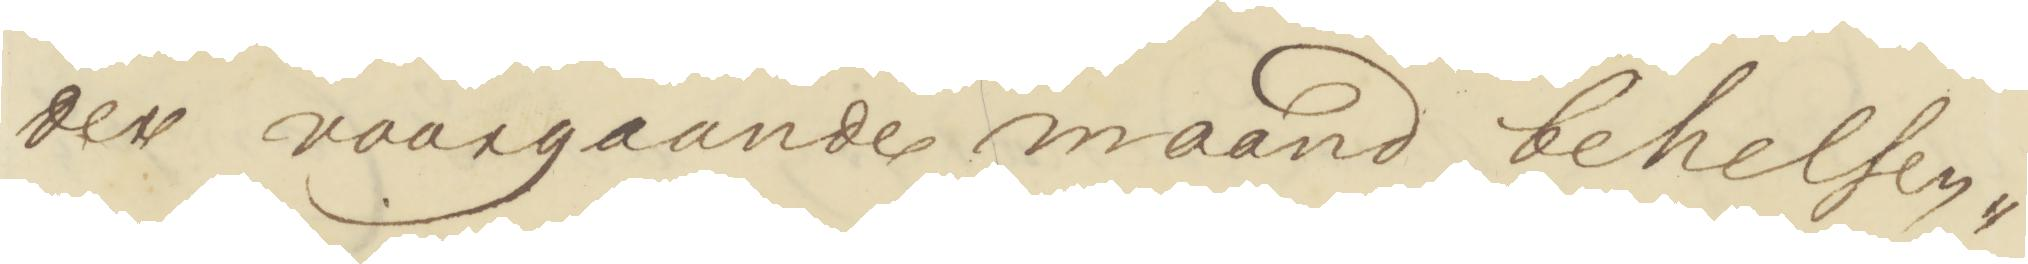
der voorgaande maand behelsen„
